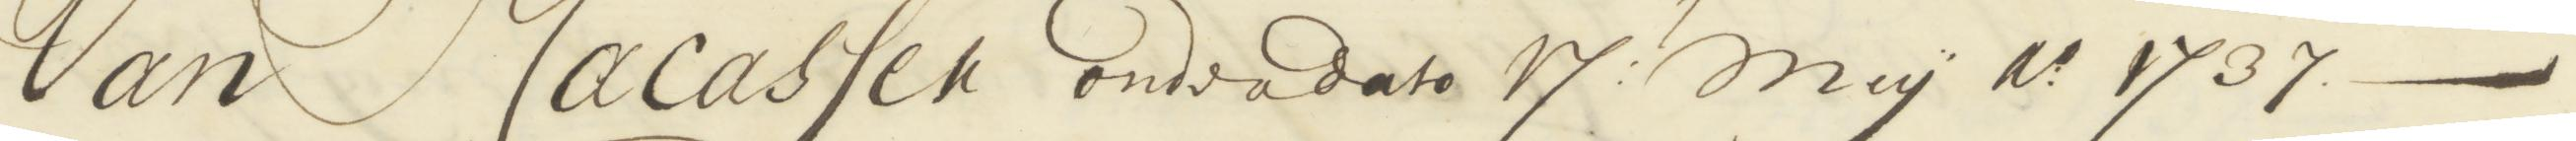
Van Macasser onder dato 17:' meij a:o 1737. —
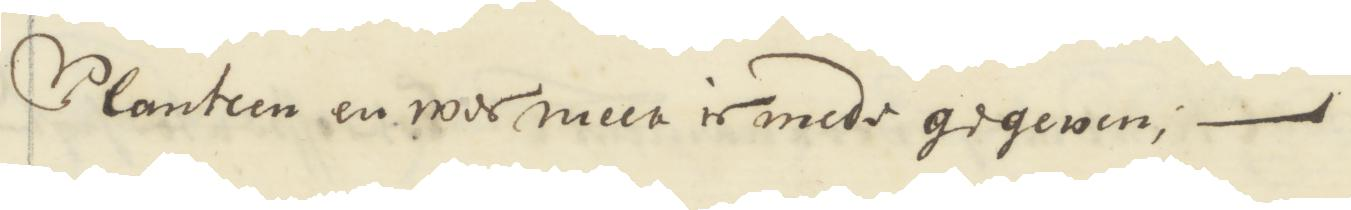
Planken en wes meer is mede gegeven; —
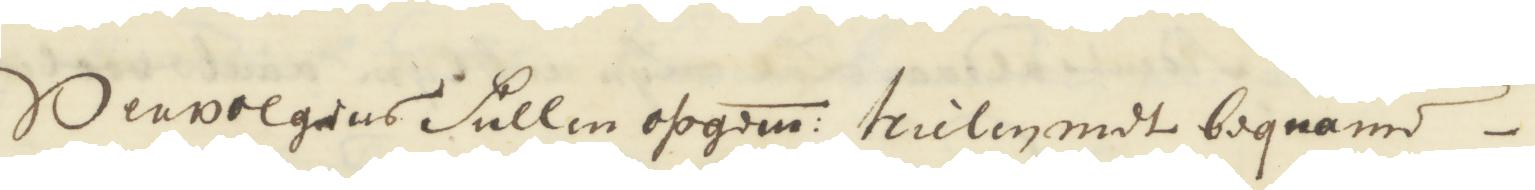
Vervolgens sullen opgem: kielen met bequame —
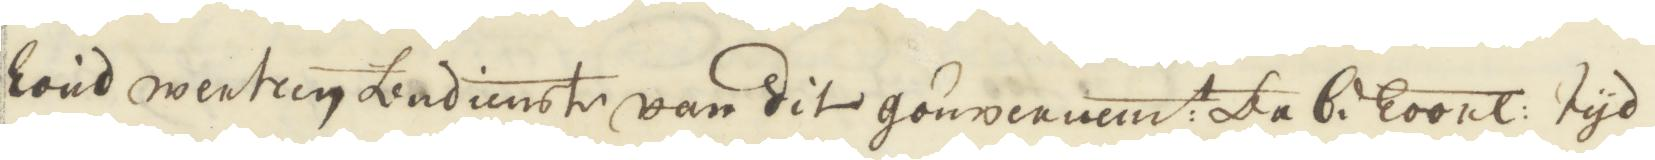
houd werken tendienste van dit gouvernem:t ter b„hoorl: tijd
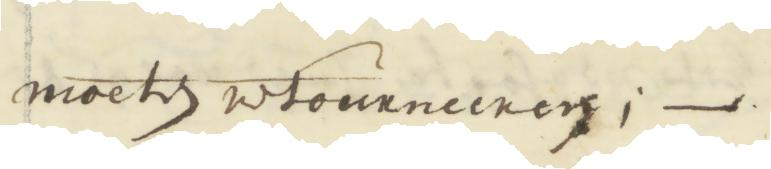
moeten retourneeren; —
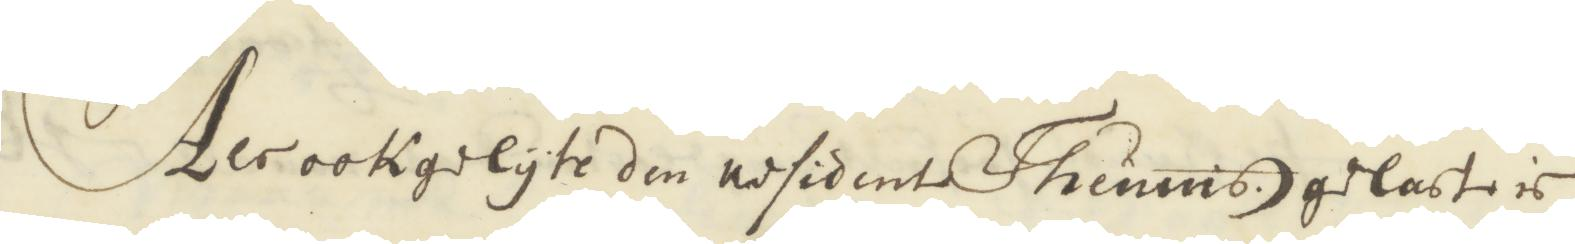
Als ook gelijk den resident Theunis: gelast is
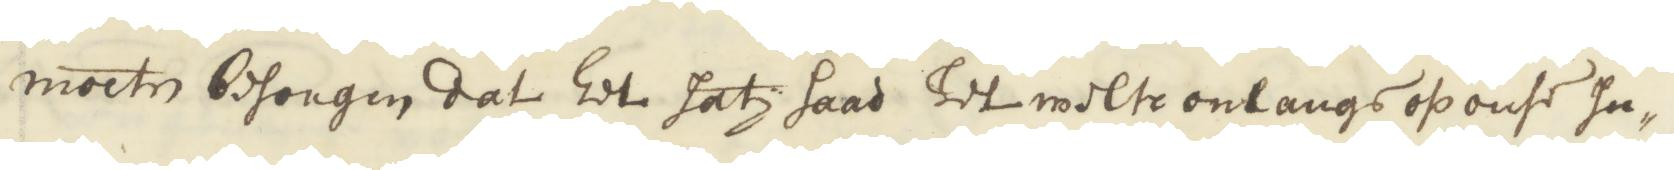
moeten besorgen dat het Jatij saad het welk onlangs op onse Jn„
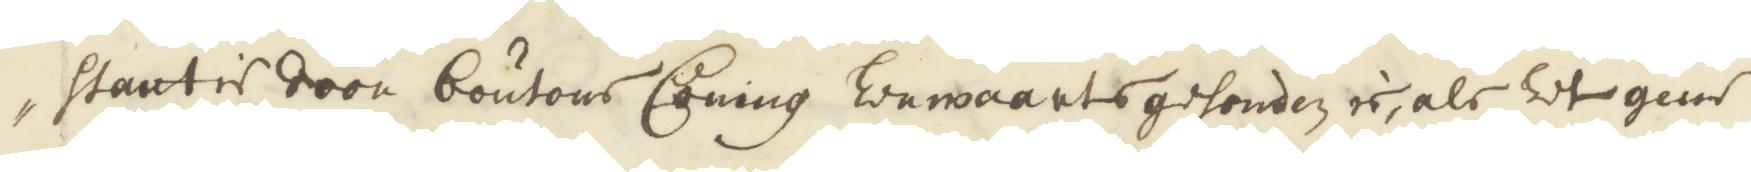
„stant is door boutons Coning herwaarts gesonden is, als het gene
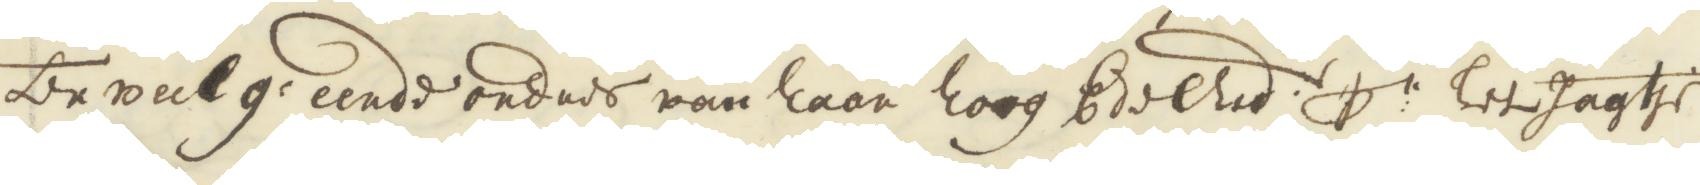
ter veel g’ eerde ordres van haar hoog Edelhed:s p:r het Jagtje
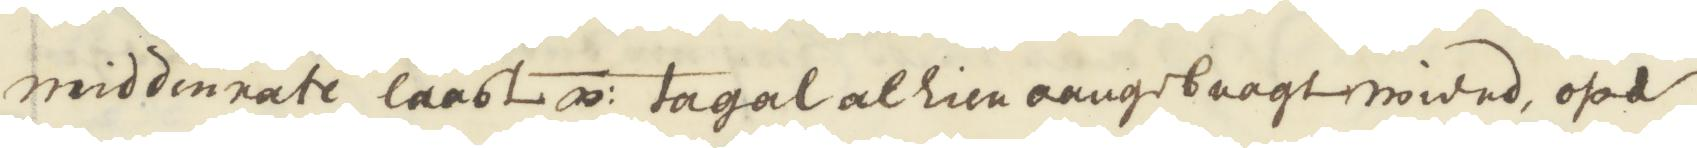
middenrate laast v: tagal al hier aangebragt wierd, op de
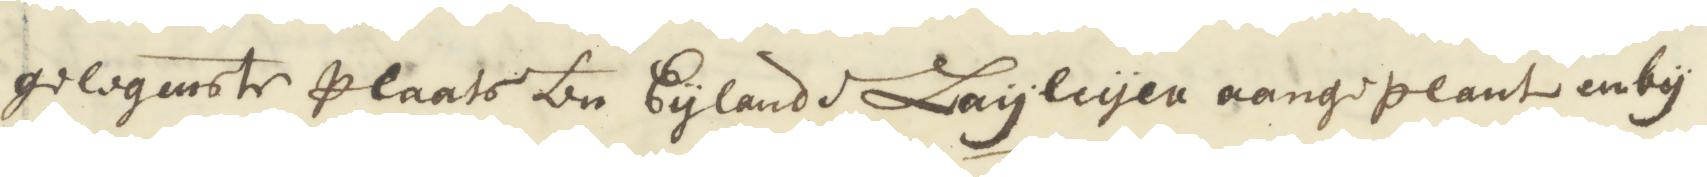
gelegenste plaats ten Eijlande Zaijleijer aangeplant en bij
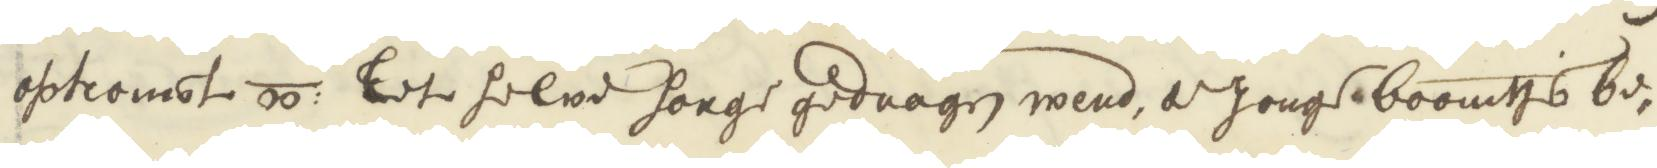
opkomst v: het selve sorge gedragen werd, de Jonge boomtjs be
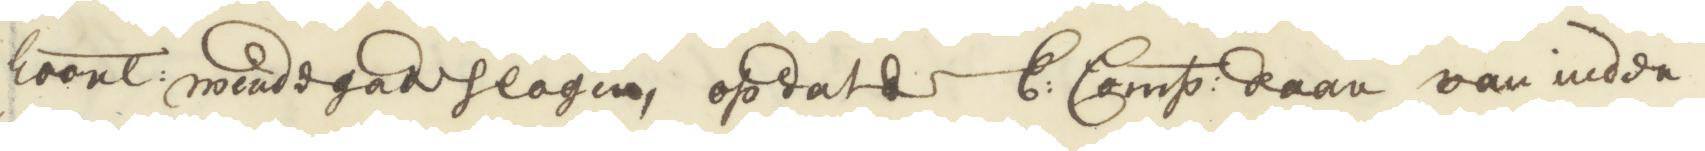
hoorlijk werde gadeslagen, op dat de E: Comp: daar van inder
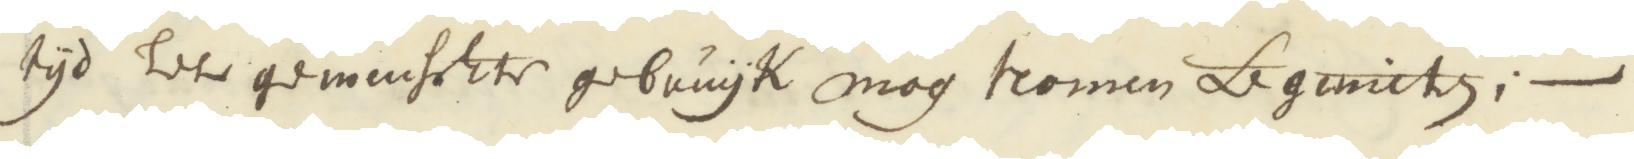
tijd het gewenschte gebruijk mog komen te genieten; —
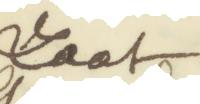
zaat
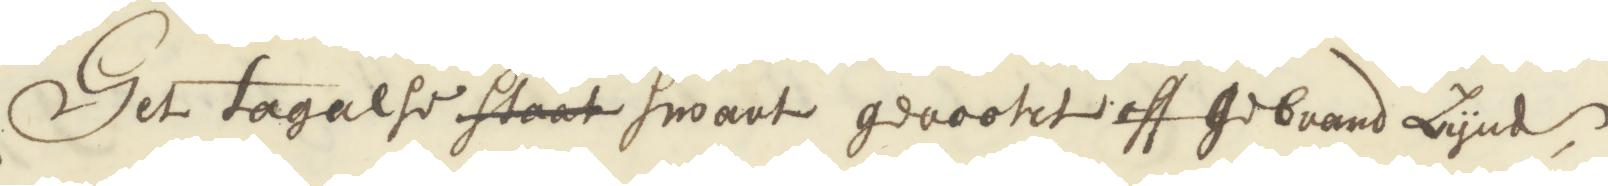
Het tagalse staat swart gerookte off gebrand zijnde,
